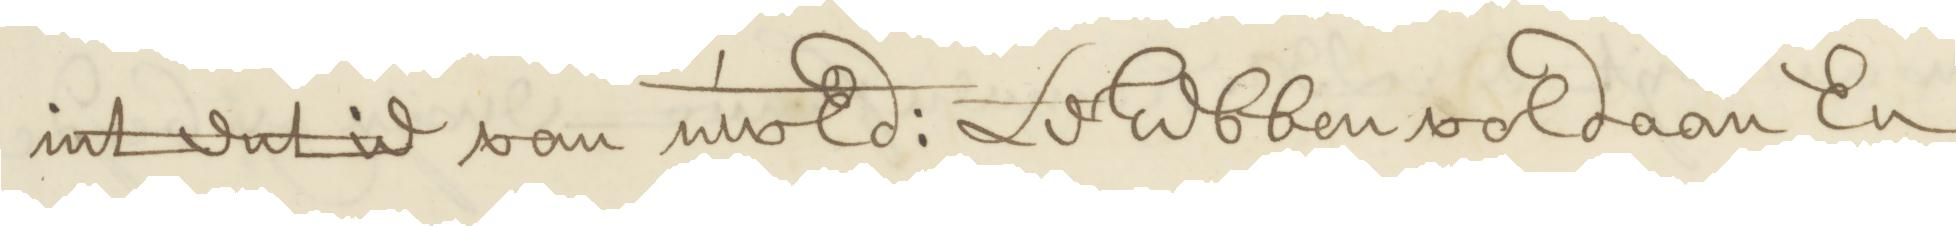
intentie van uw Ed: te hebben voldaan En
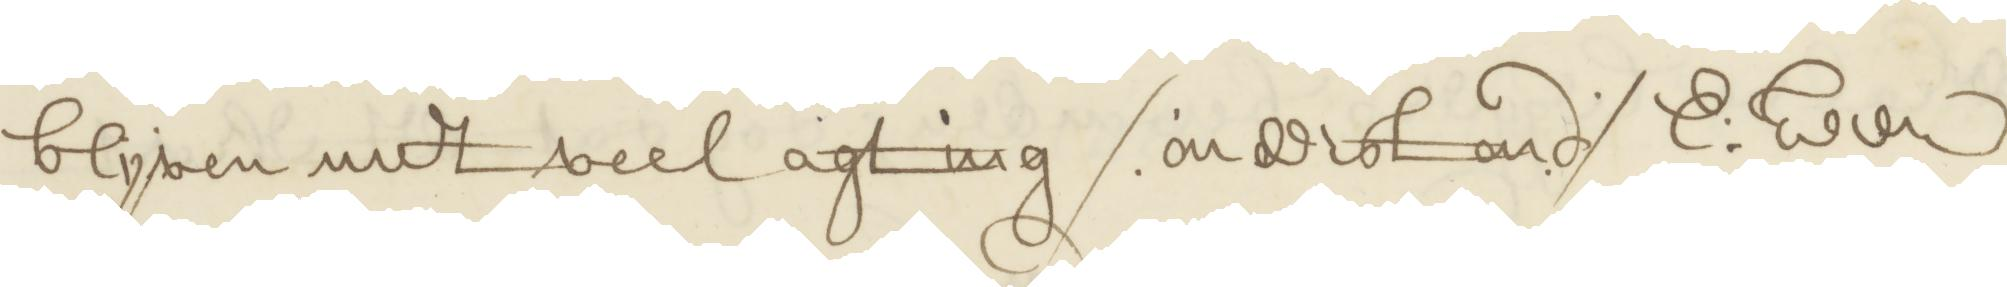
blijven met veel agting /:onderstond:/ E: heer
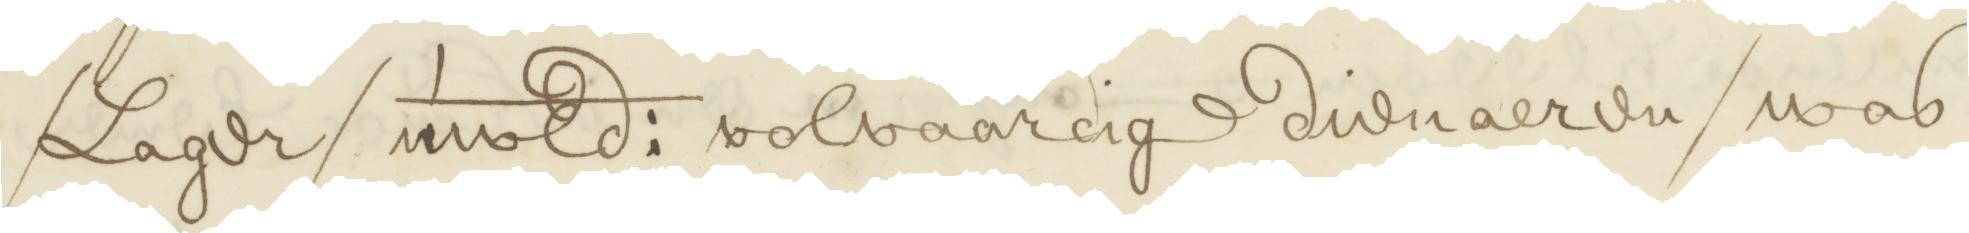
/Lager/ uwEd: volvaardige dienaeren /was
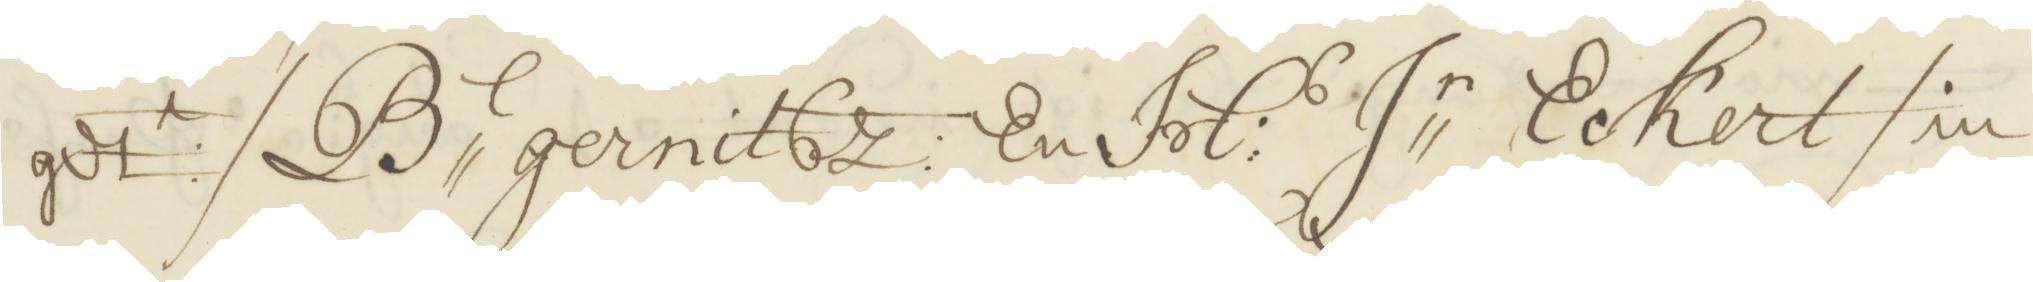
get:t/ B„l gernitsz: En M:s J„n Eckert /in
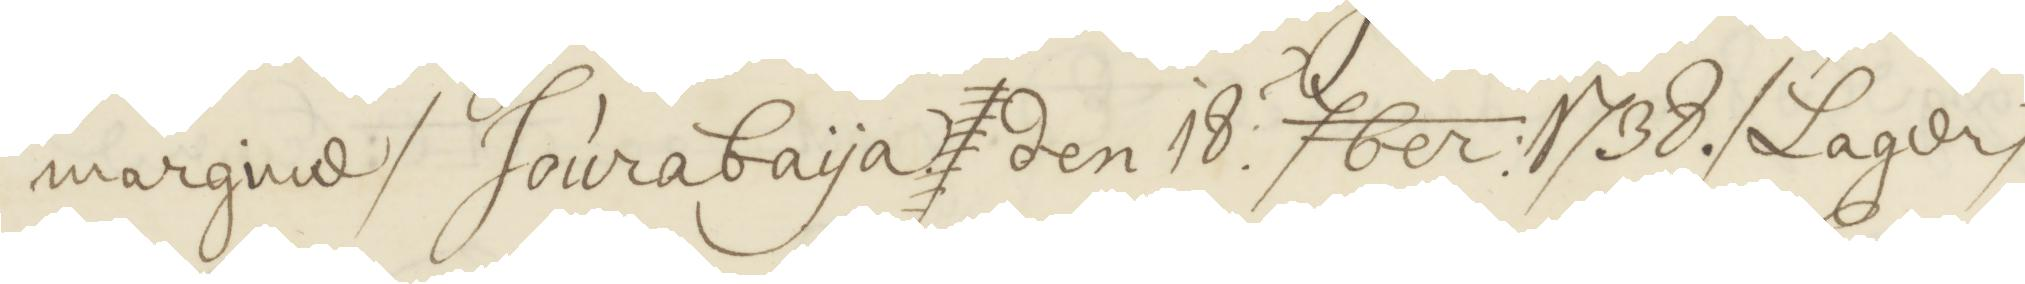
margine/ Sourabaija den 18:' 7ber: 1738. /Lager/
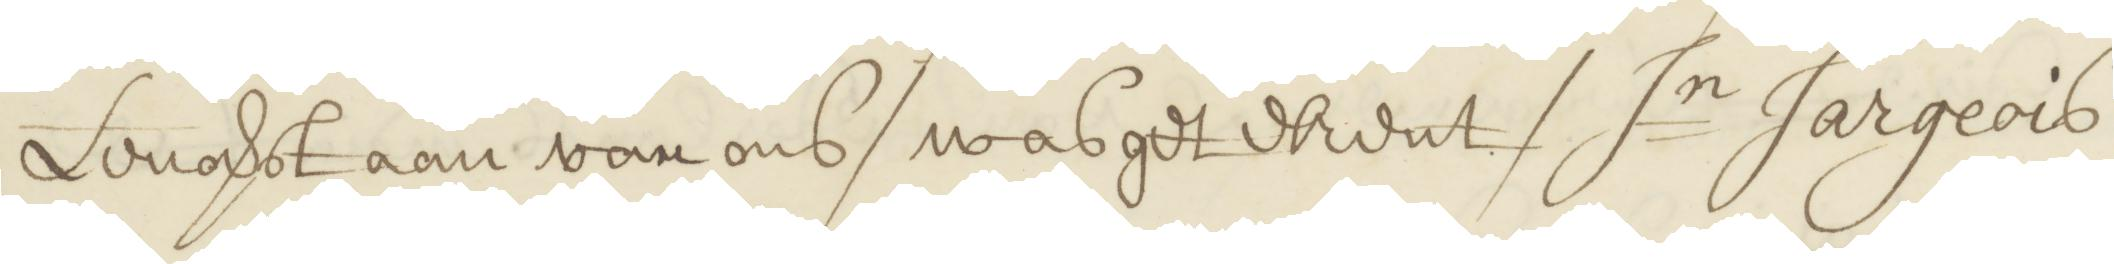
tenoverstaan van ons /was getekent/ J=n Sargeois
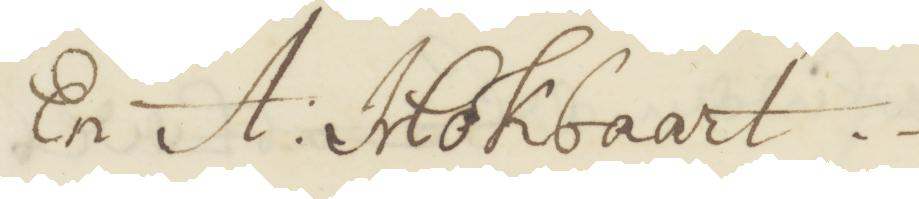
En A: Moksaart.
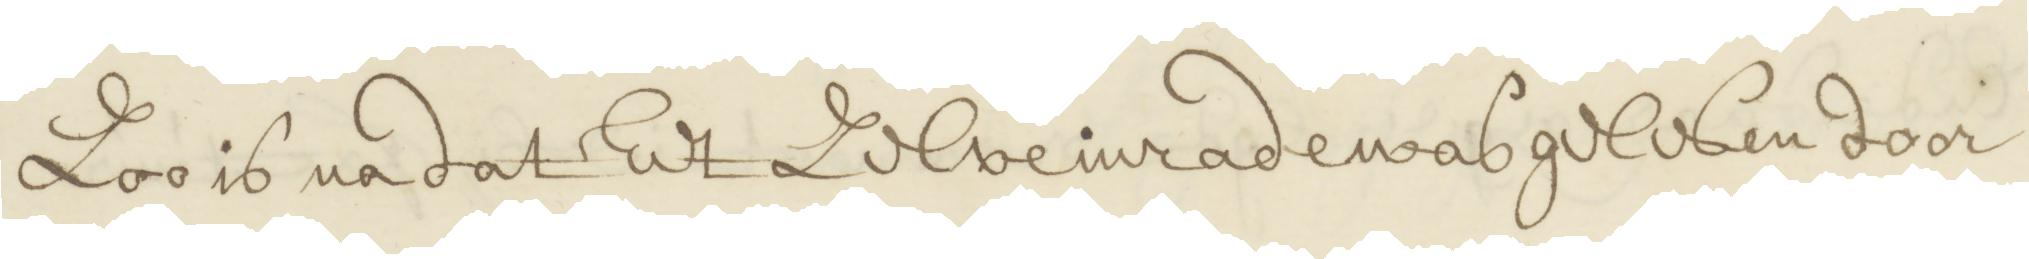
Zoo is na dat het zelveinradewas gelesen door
